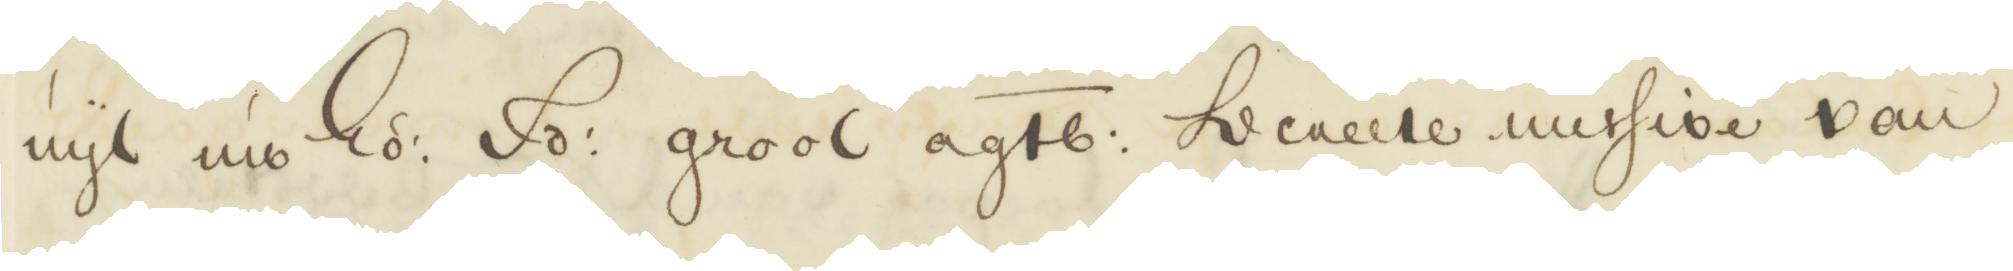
uijt uw ho: Ed: groot agtb: Secreete missive van
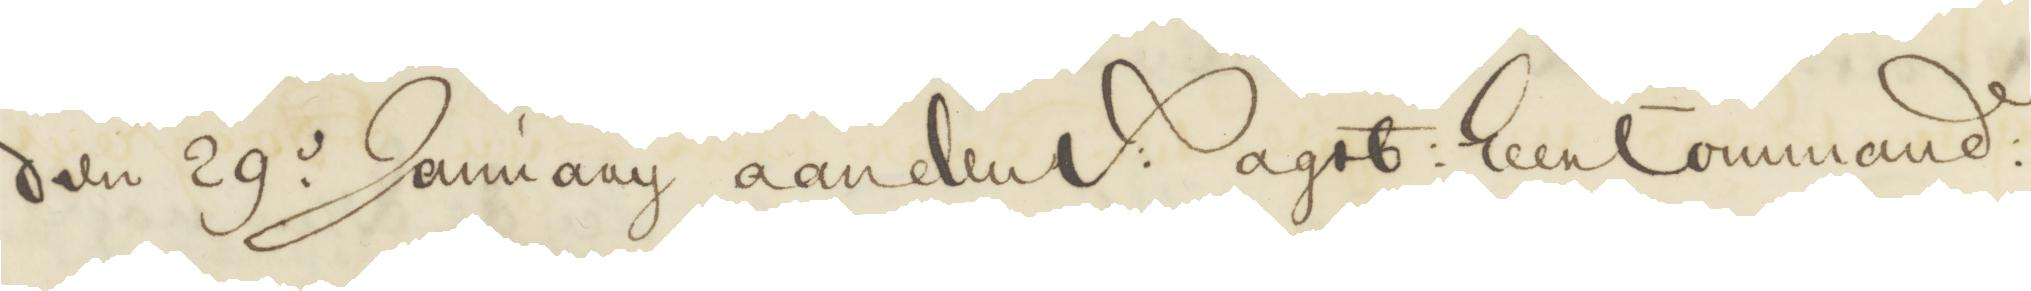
den 29.e Januarij aan den E: agtb: heer Command:
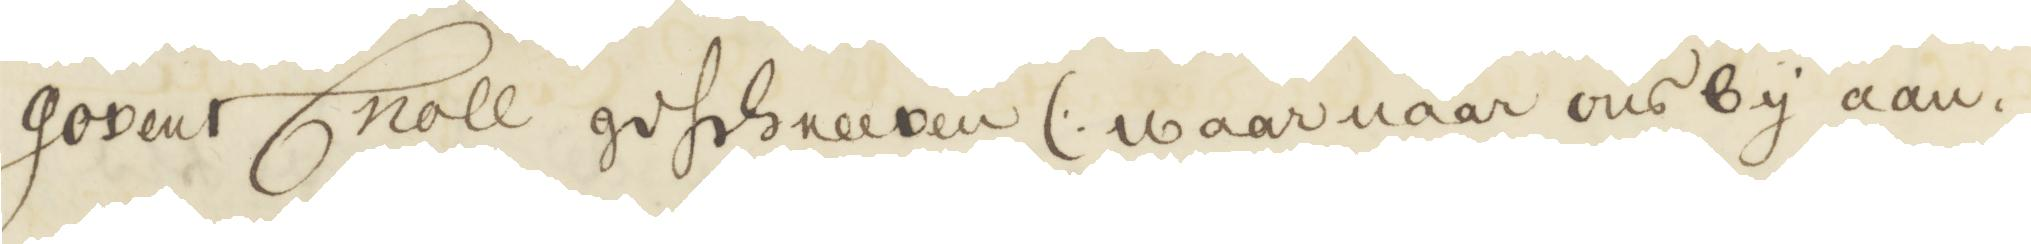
govert Cnoll geschreeven (:waarnaar ons bij aan„
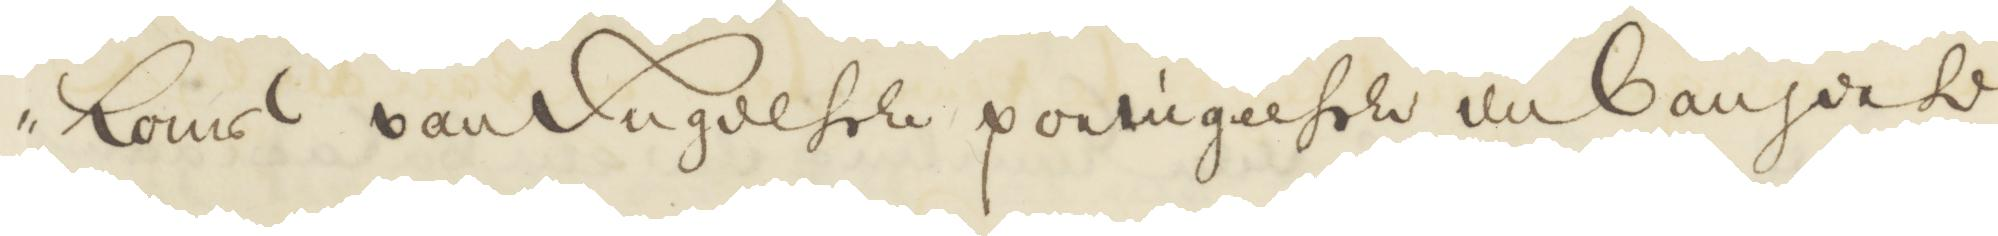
„komst van Engelsche portugeesche en banjerse
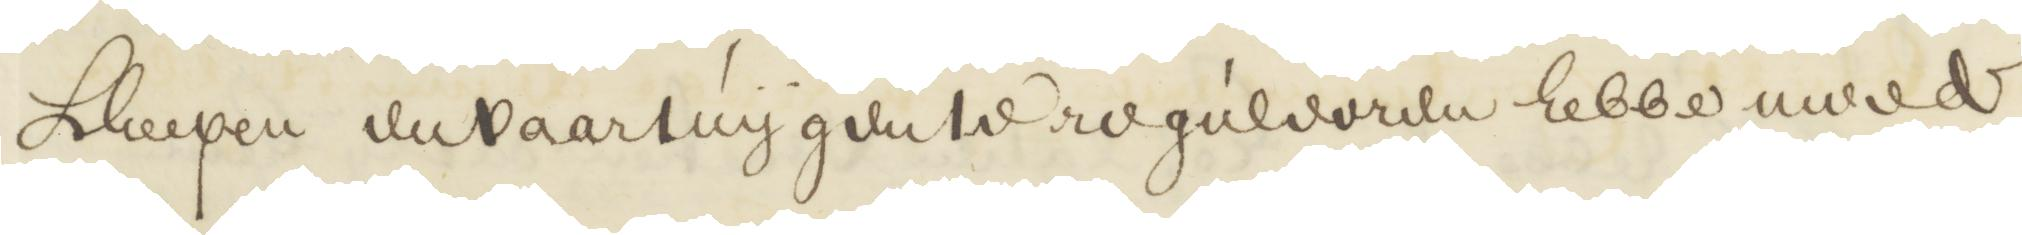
Scheepen en vaartuijgen te reguleeren hebbe meede
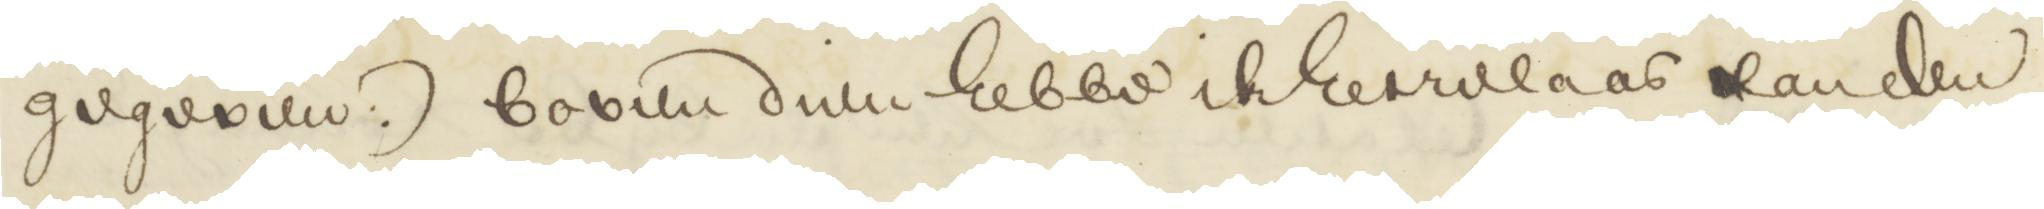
gegeven:) boven dien hebbe ik het relaas van den
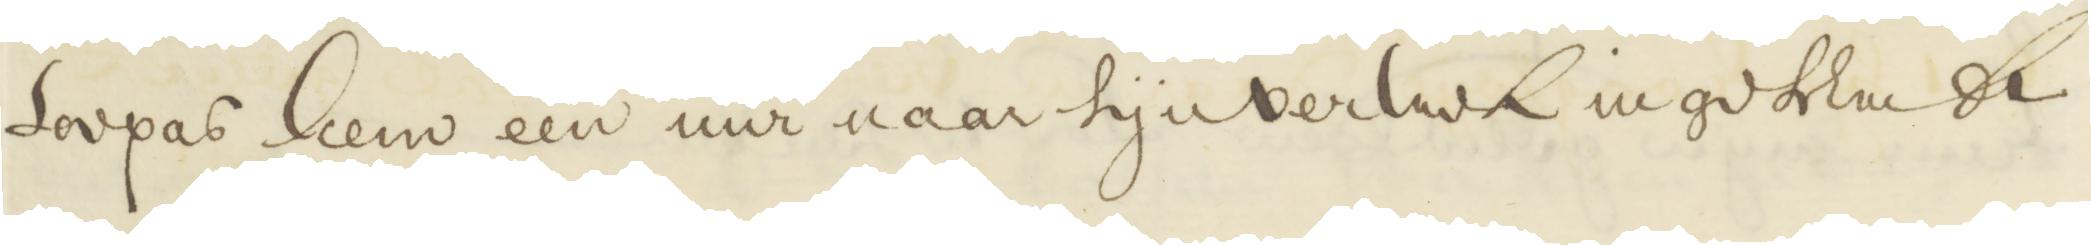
toepas hem een uur naar sijn vertrek in geschrift
